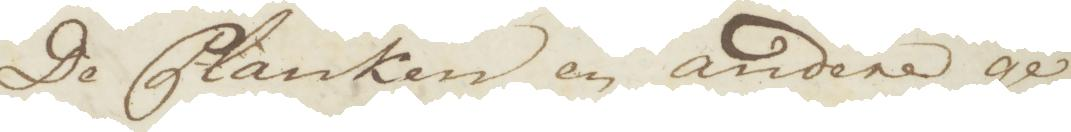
De Planken en andere ge
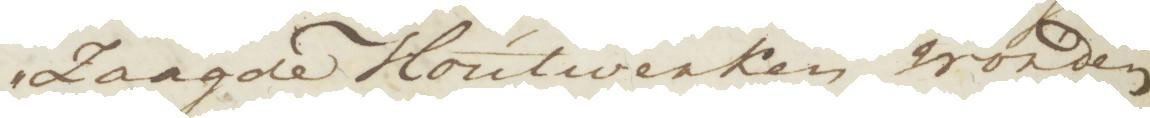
„zaagde Houtwerken worden
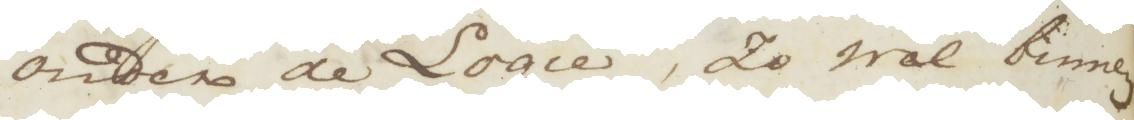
onder de Logie , zo wel binnen
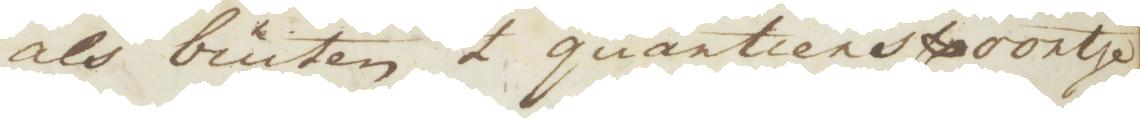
als buiten t quartierspoortje
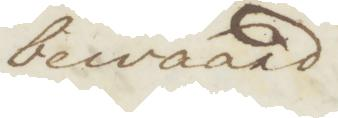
bewaard
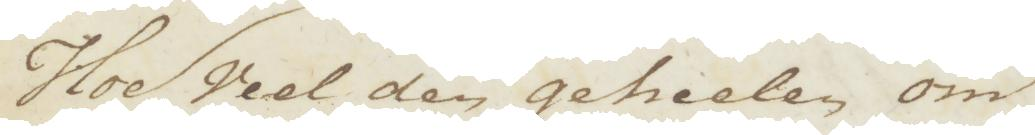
Hoe veel den geheelen om
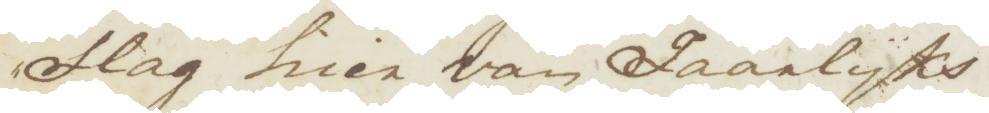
„slag hier van Jaarlijks
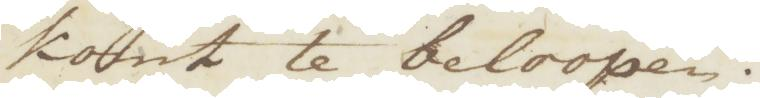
komt te beloopen.
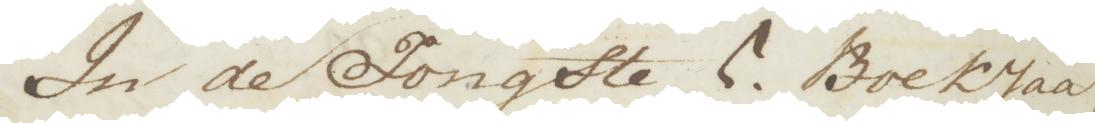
In de Jongste 5. Boekjaa
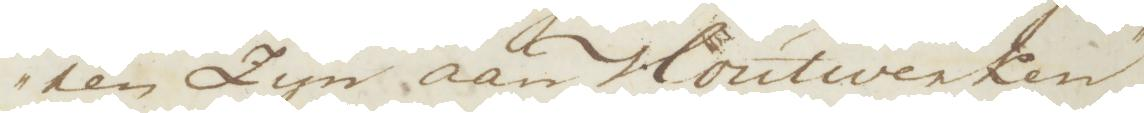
„ren Zijn aan Houtwerken
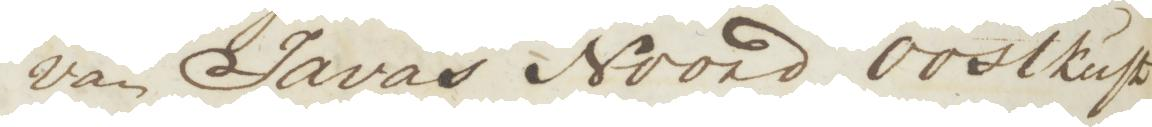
van Javas Noord Oostkust
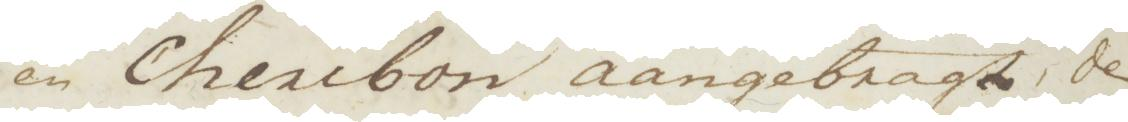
en Cheribon aangebragt, de
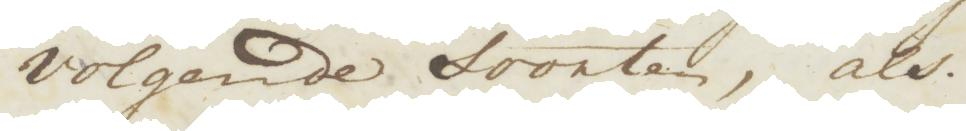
volgende soorten, als.
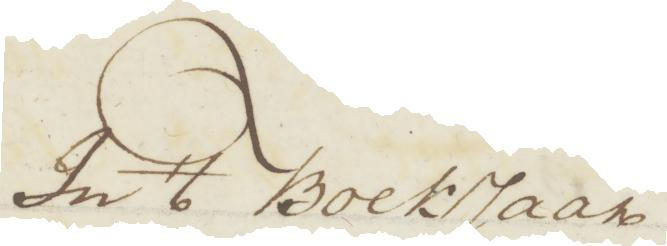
In 't Boek Jaar
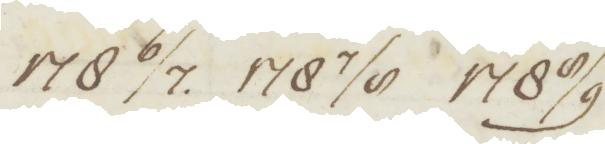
178 6/7. 178 7/8 178 8/9
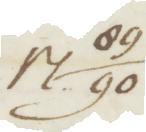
17 89/90
